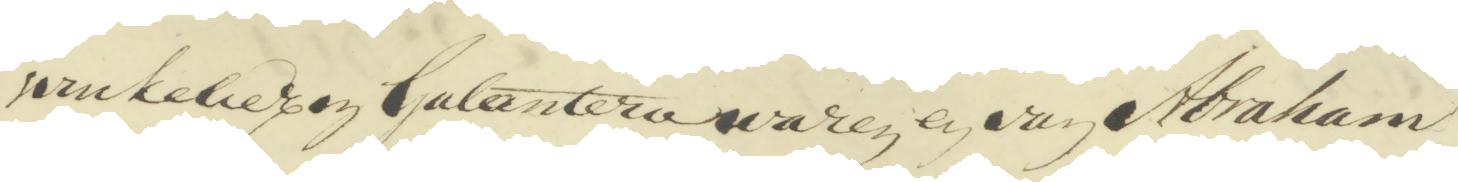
winkelieren Galanteriewaren en van Abraham
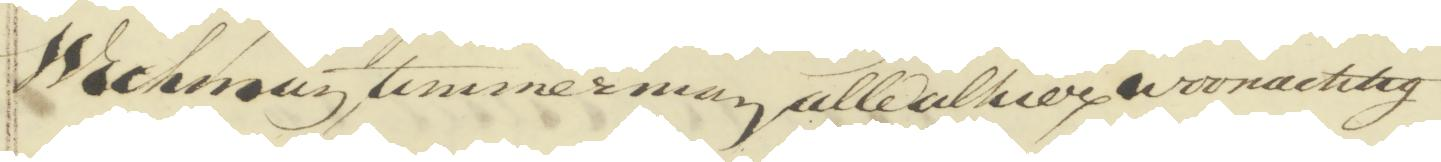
Wichman, timmerman alle alhier woonachtig
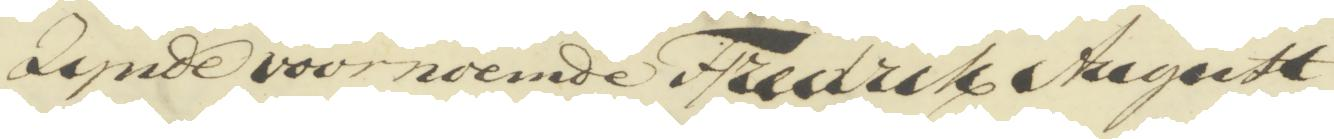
Zynde voornoemde Fredrik August
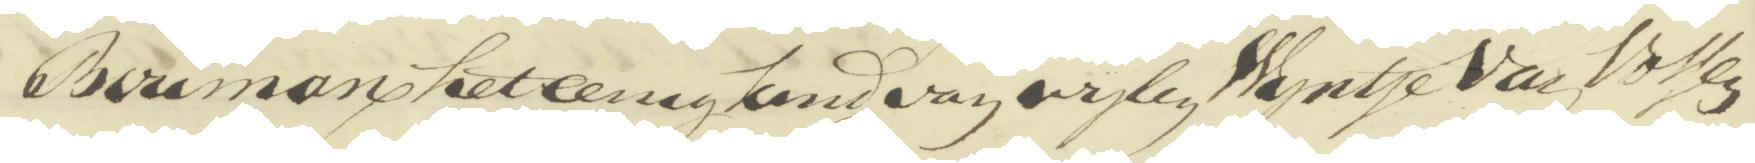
Bouman het eenig kind van wijlen Wyntje van Vossen
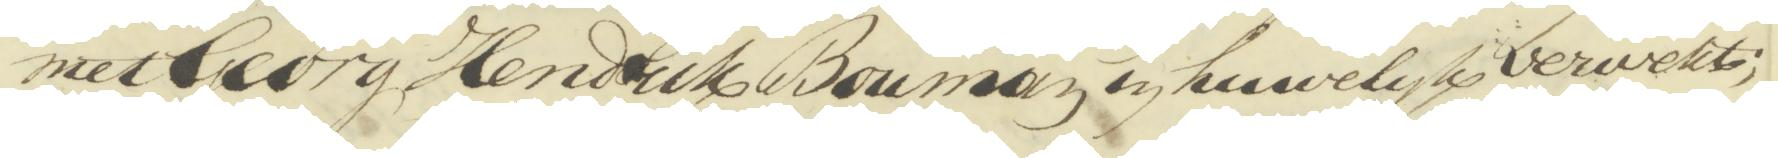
met Georg Hendrik Bouman in huwelyk verwekt;
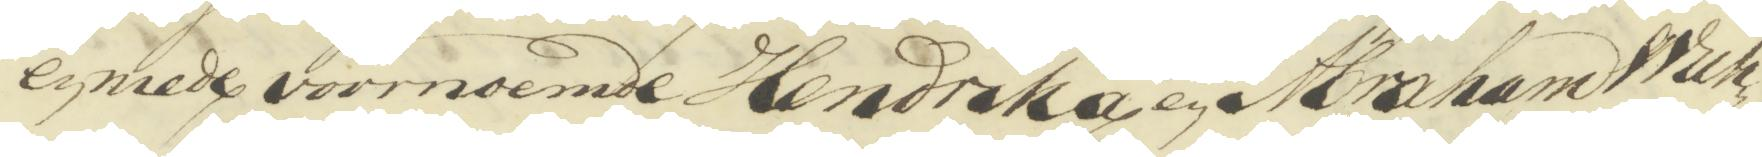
en mede voornoemde Hendrika en Abraham Wich„
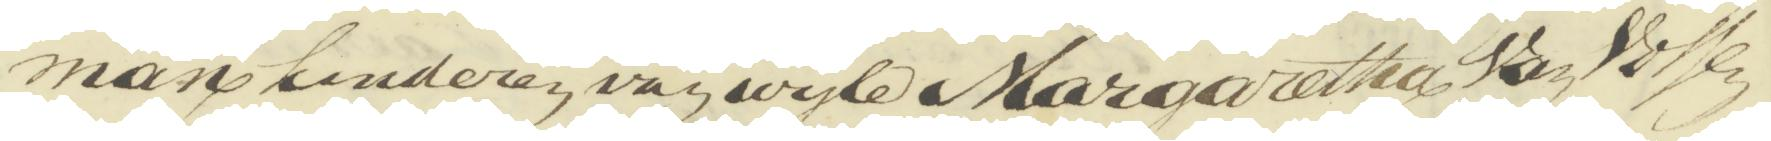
man kinderen van wyle Margaretha Van Vossen
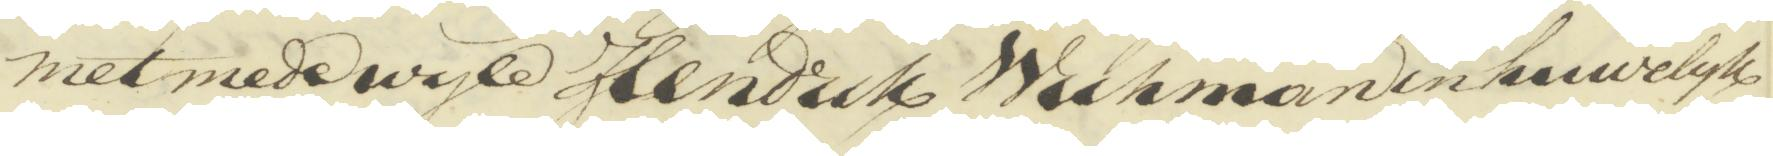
met mede wyle Hendrik Wichman in huwelyk
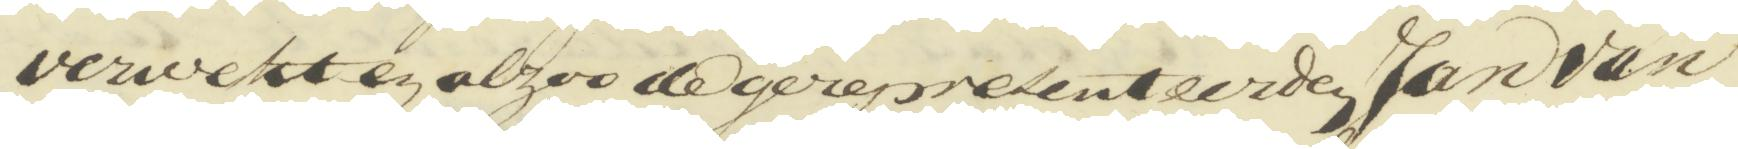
verwekt en alzoo de gerepresenteerden Jan van
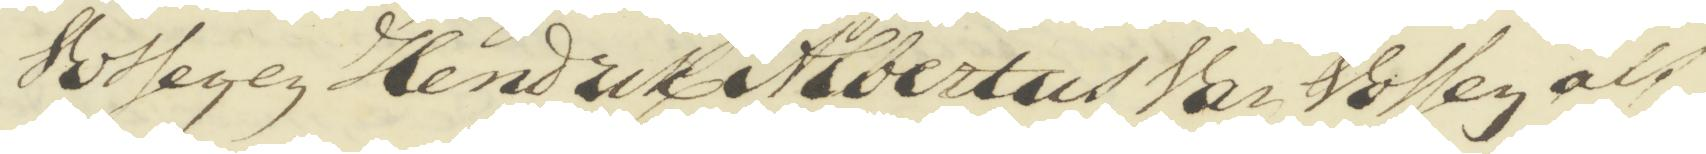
Vossen en Hendrik Albertus Van Vossen als
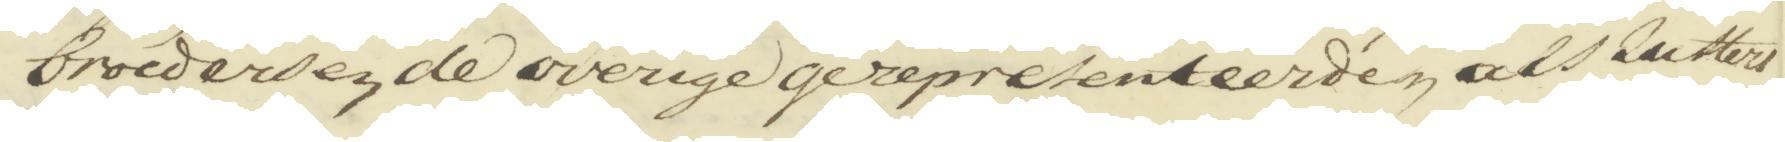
broeders en de overige gerepresenteerden als zusters
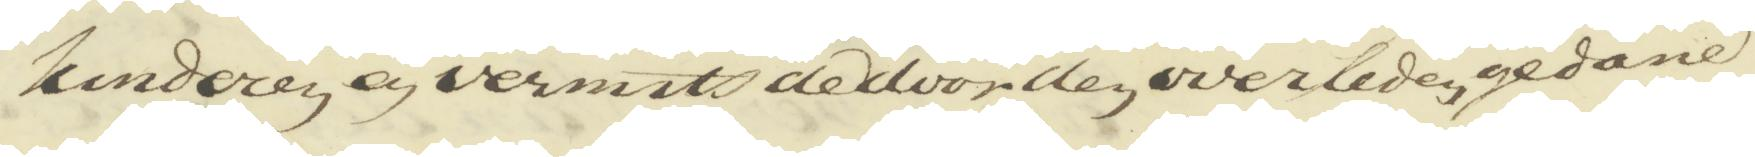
kinderen en vermits de door den overleden gedane
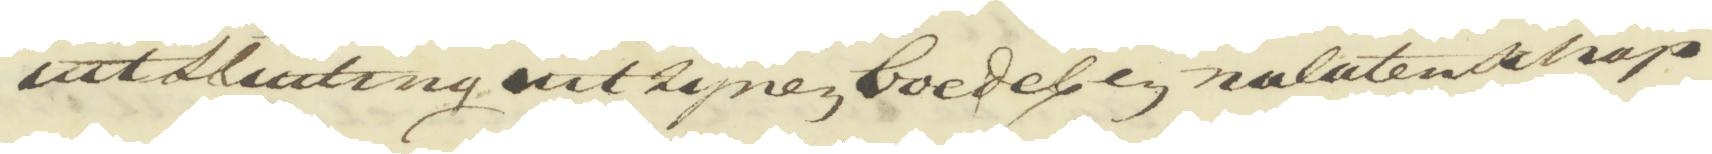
uitsluiting uit zynen boedel en nalatenschap
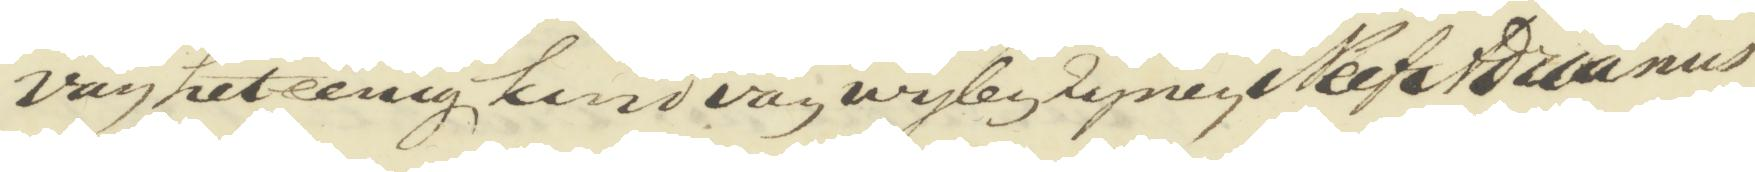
van het eenig kind van wylen zynen Neef Adrianus
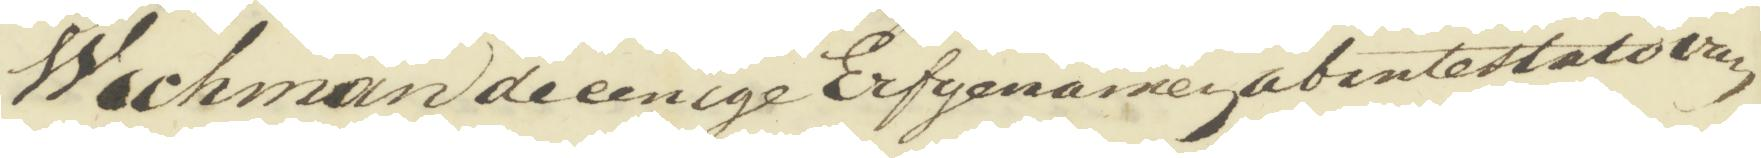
Wichman de eenige Erfgenamen abintestato van
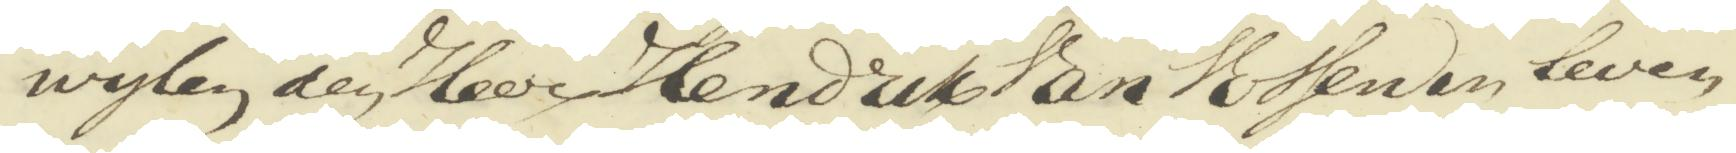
wylen den Heer Hendrik Van Vossen in leven
